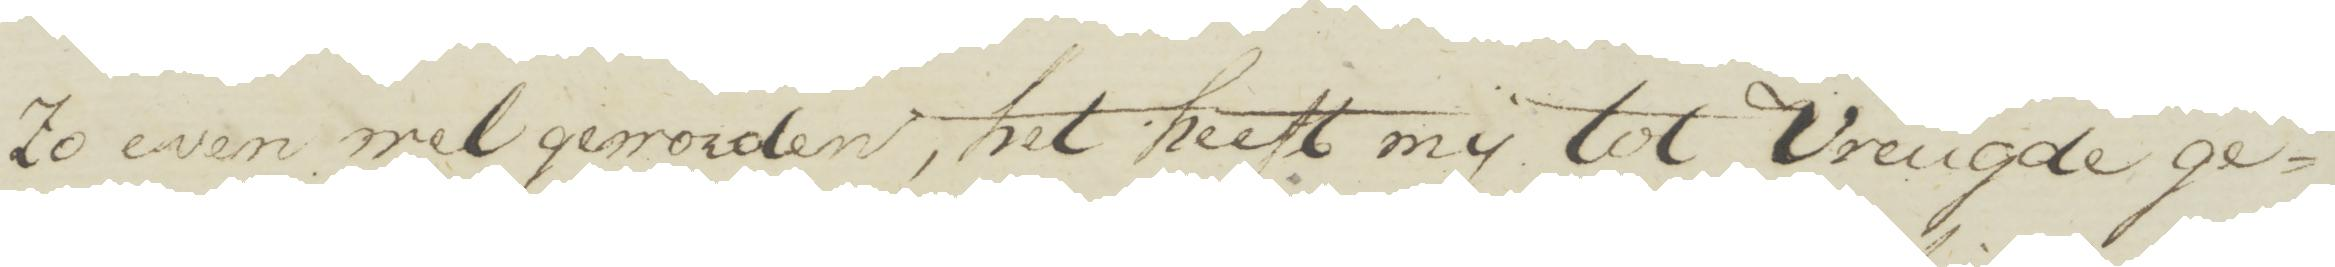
zo even wel geworden, het heeft mij tot vreugde ge=
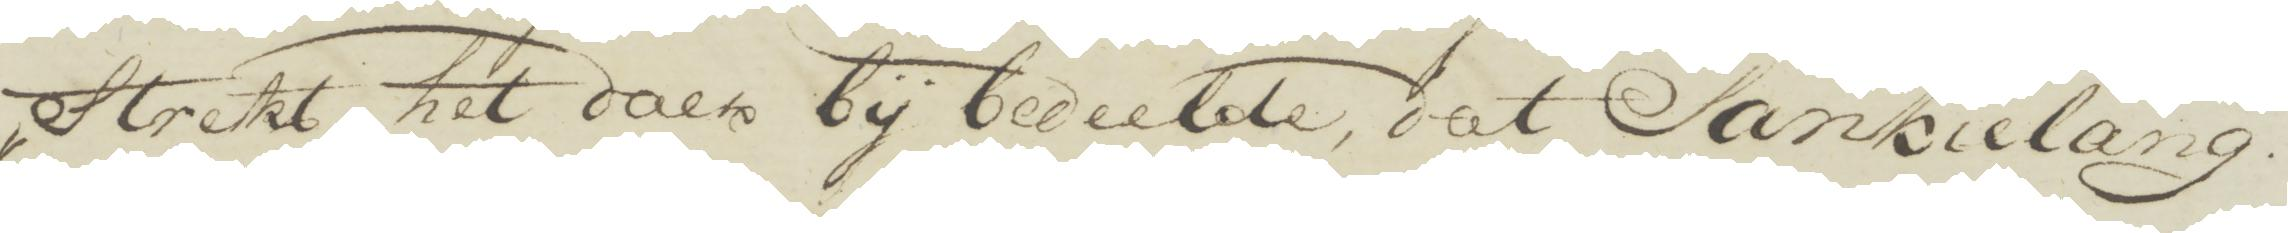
„strekt, het daer bij bedeelde, dat Sankielang
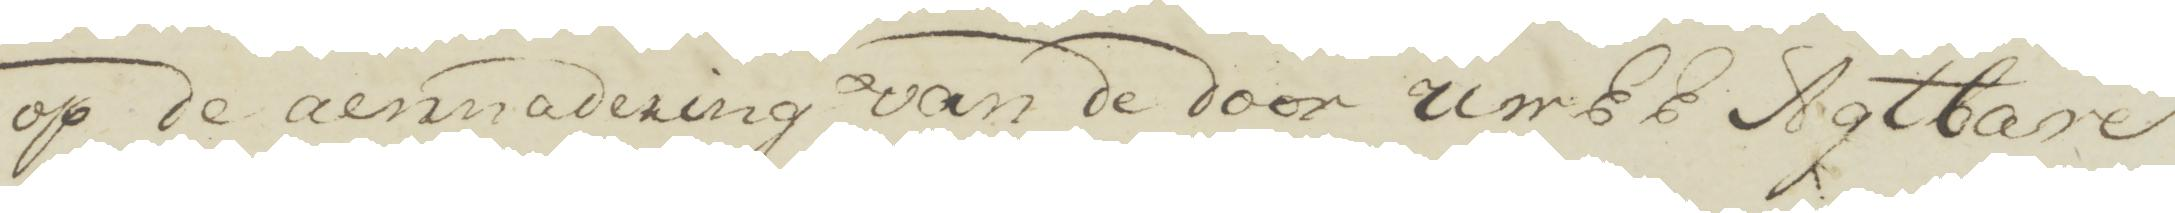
op de aennadering van de door uw EE Agtbare
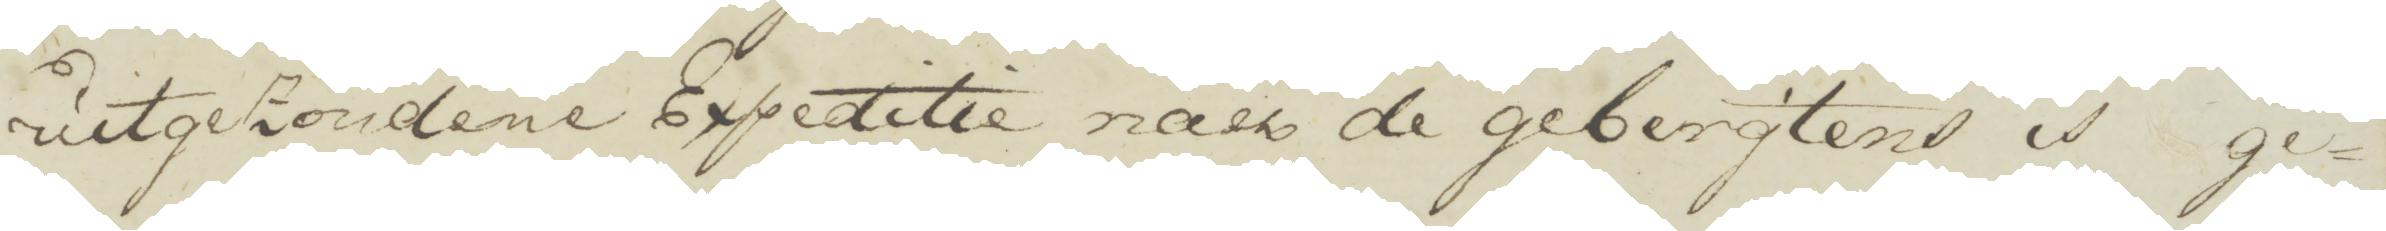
uitgezondene Expeditie naer de gebergtens is ge=
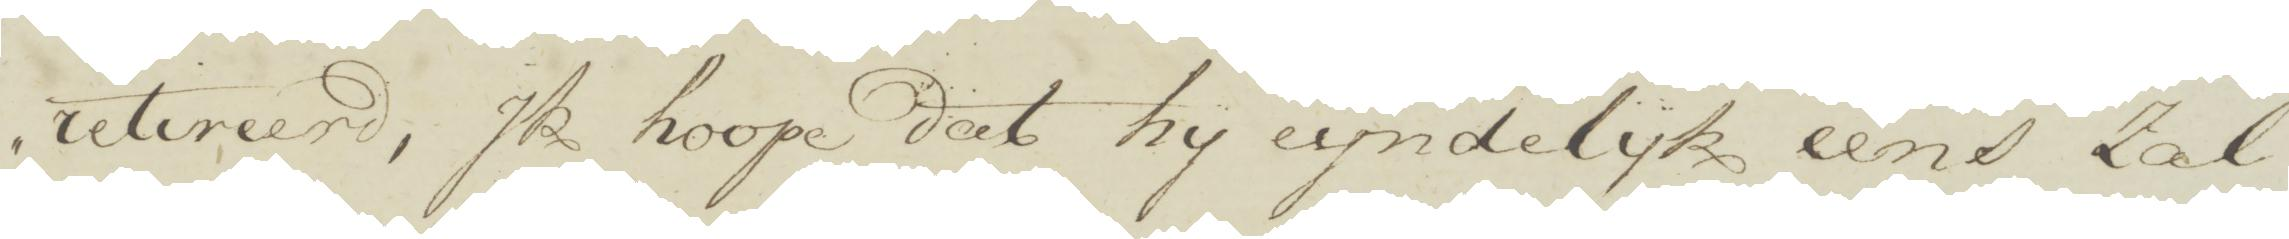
„retireerd, jk hoope dat hij eijndelijk eens zal
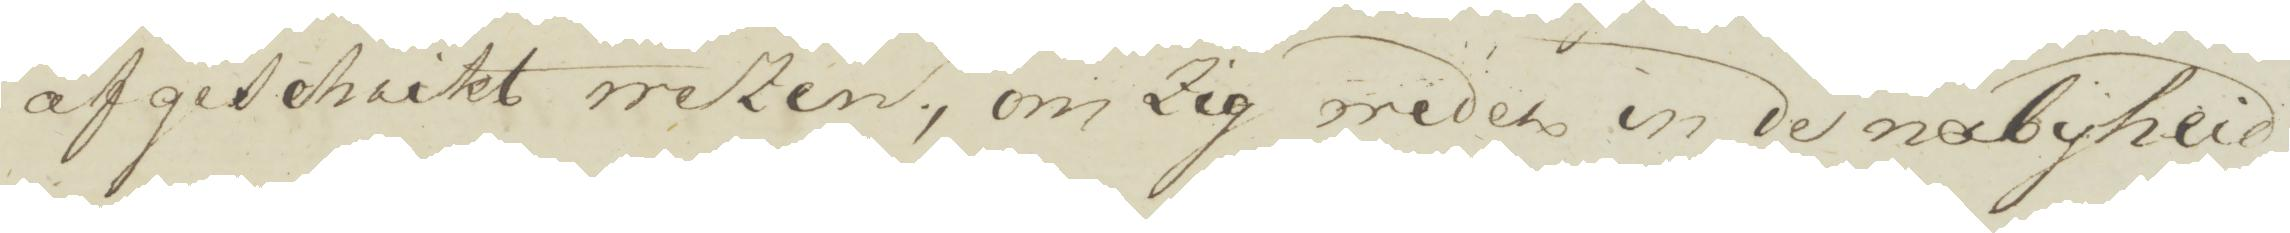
afgeschrikt wezen, om zig weder in de nabijheid
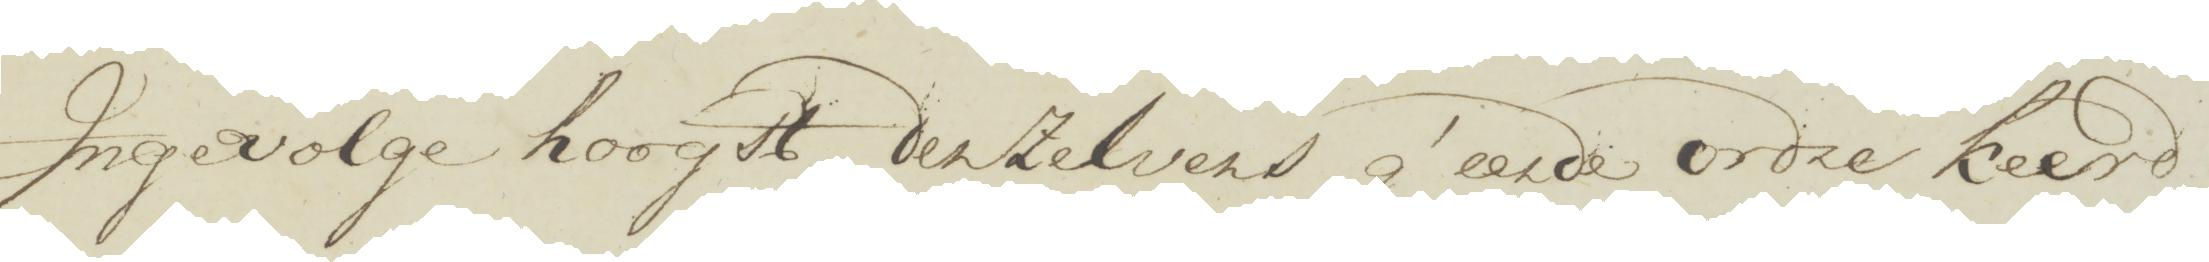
Jngevolge hoogst derzelvers g’eerde ordre keerd
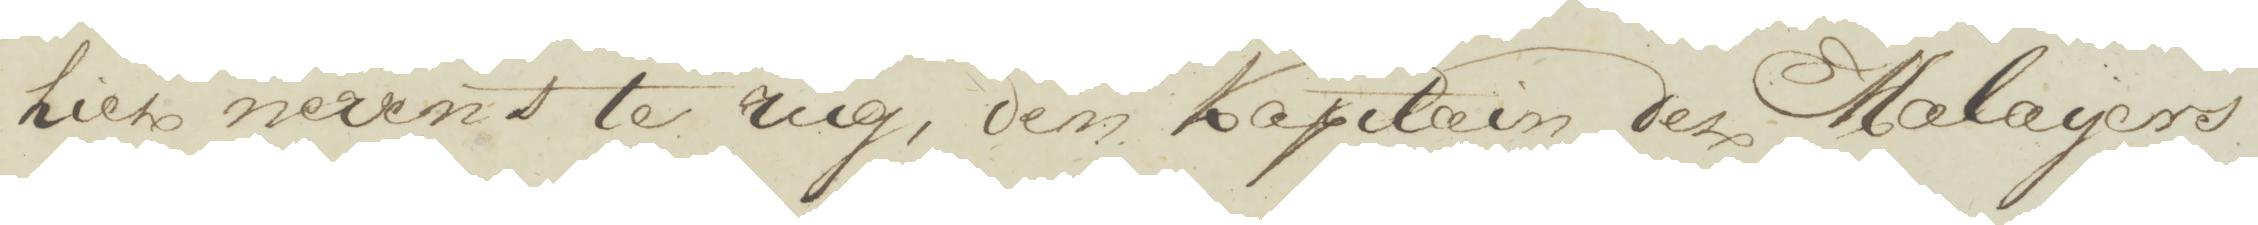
hier nevens te rug, den kapitain der Malaijers
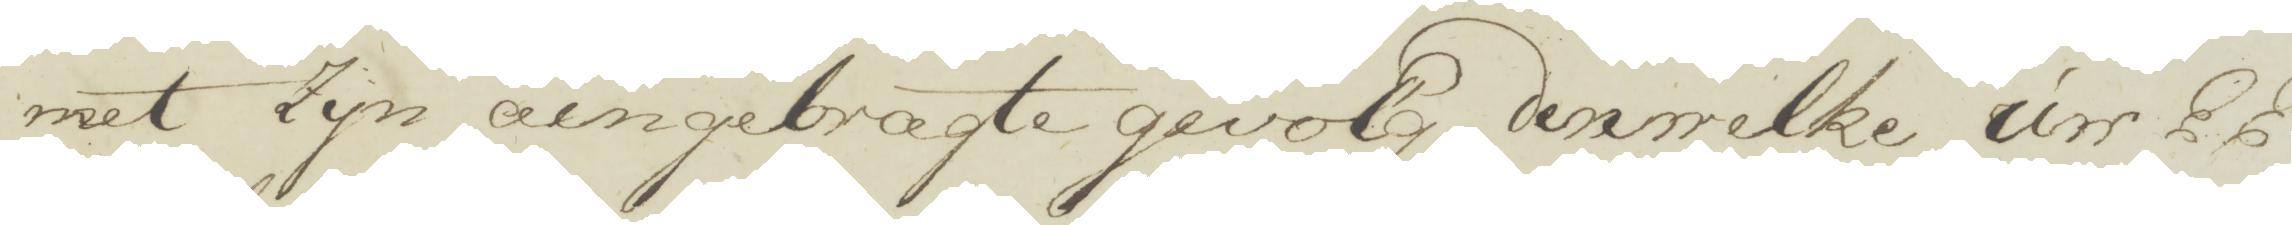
met zijn aengebragte gevolg, denwelke uw EE
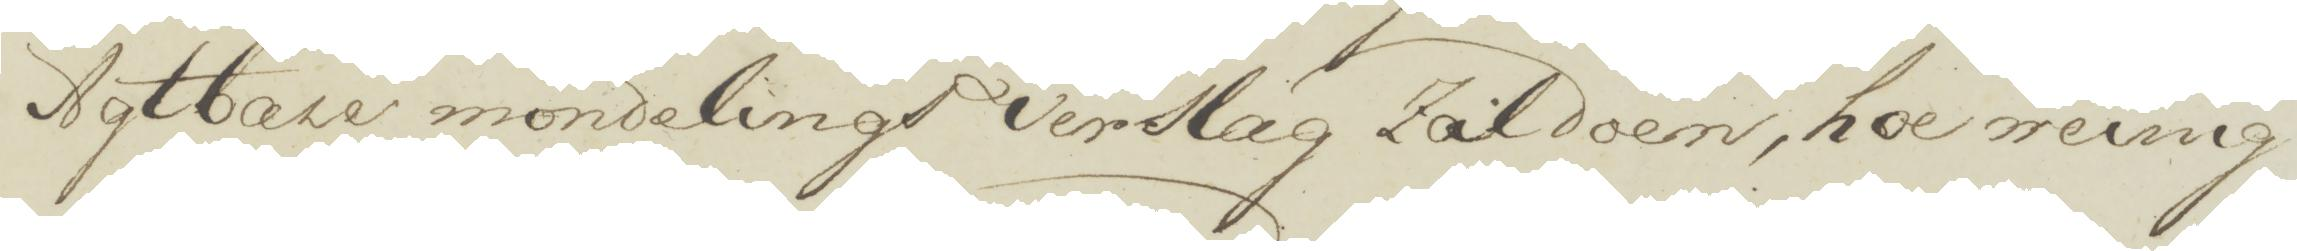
Agtbare mondelings verslag zal doen, hoe weinig
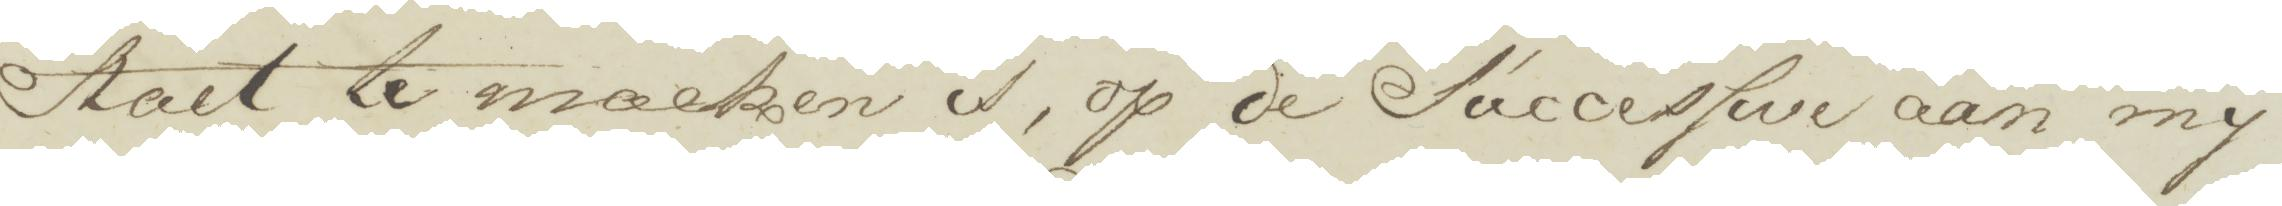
staet te maeken is, op de successive aan mij
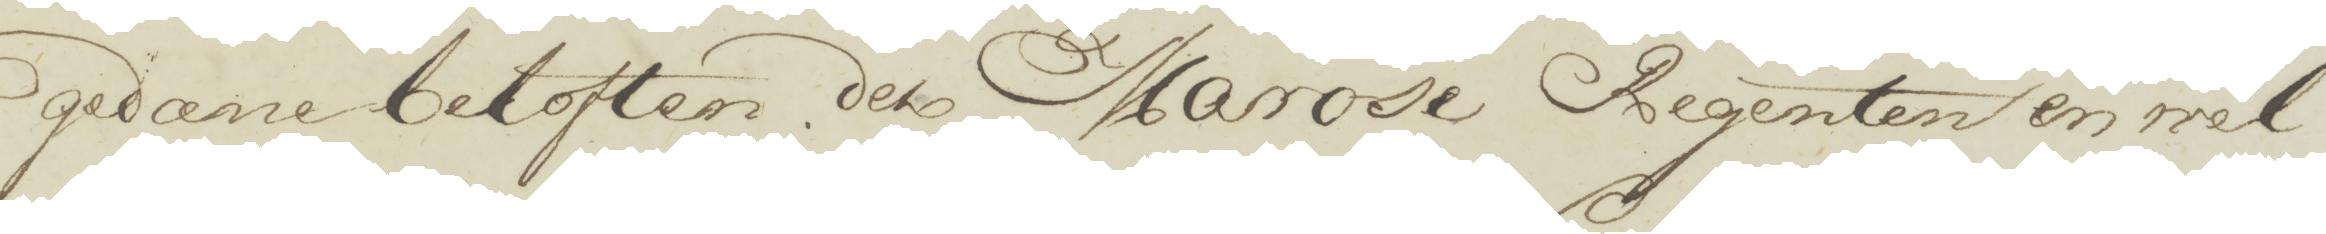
gedane beloften der Marose Regenten en wel
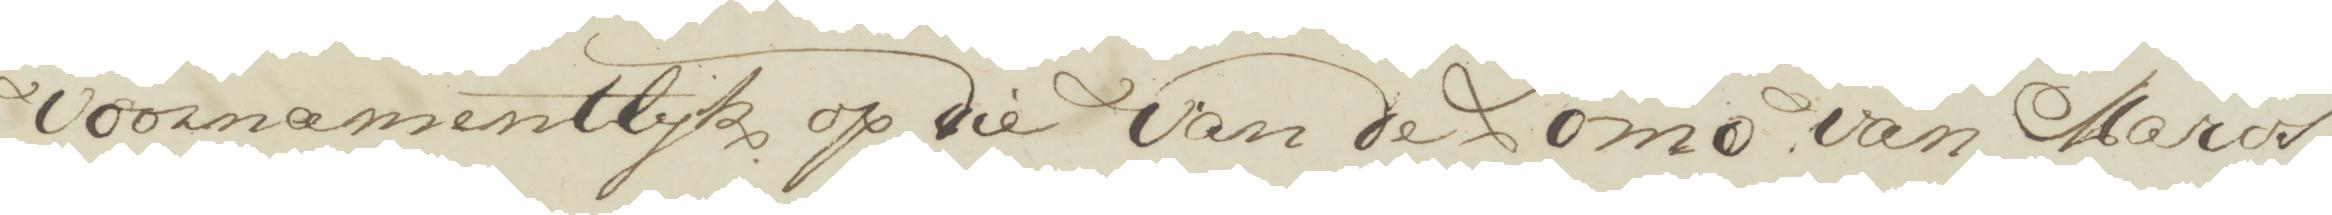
voornamentlijk op die van de Lomo van Maros,
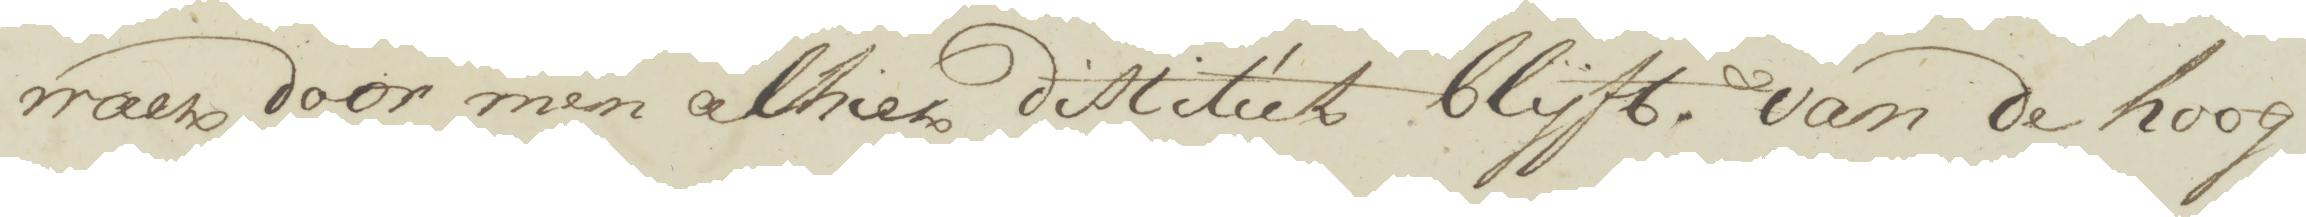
waer door men alhier distitut blijft, van de hoog
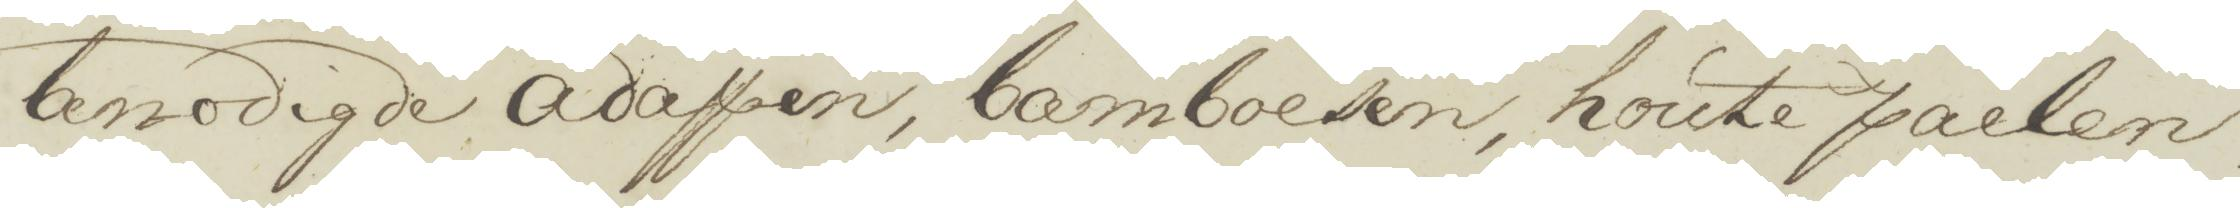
benodigde adappen, bamboesen, houte paelen
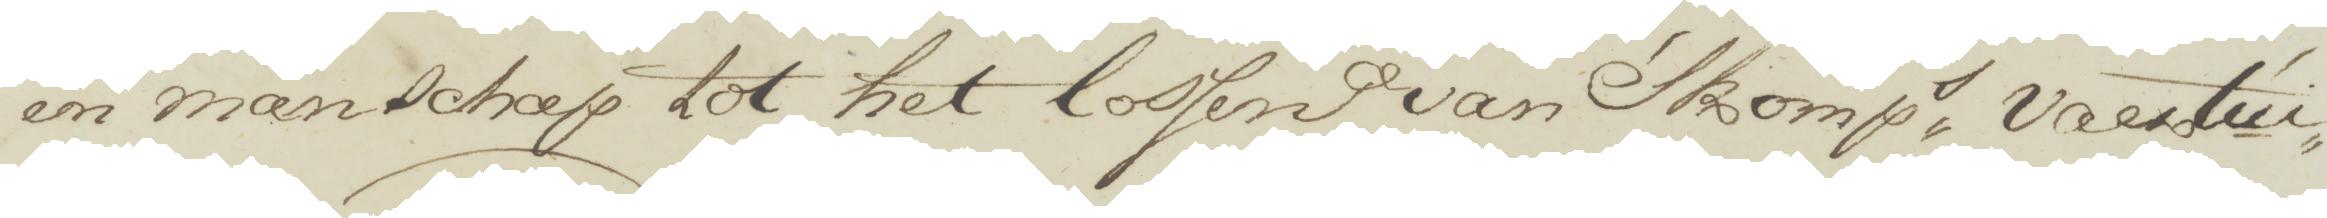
en manschap tot het lossen van 'sComp„s vaertui„
